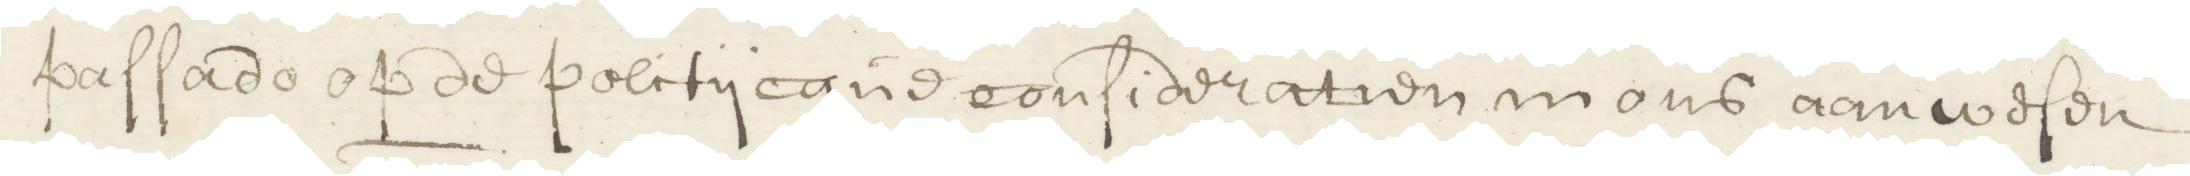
passado op de politijcque consideratien in ons aanwesen
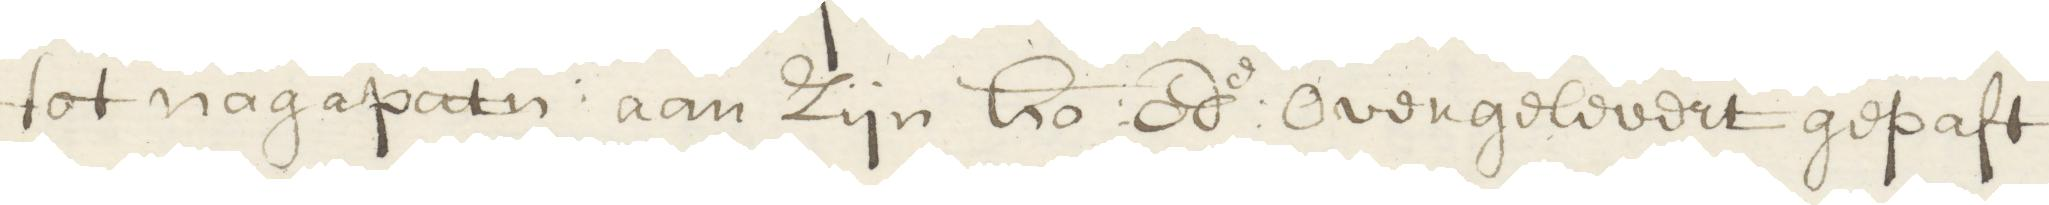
tot nagapatn: aan zijn ho: Ed:e overgelevert gepast
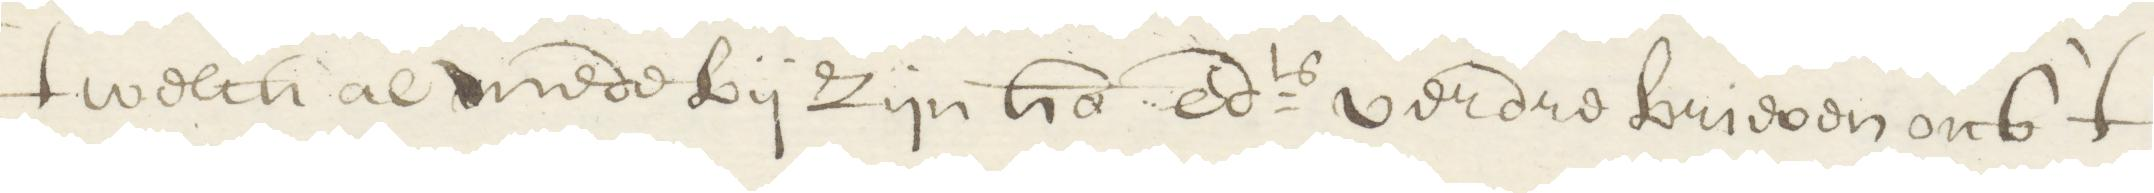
't welck al mede bij zijn ho: Ed=s verdre brieven ons ’t
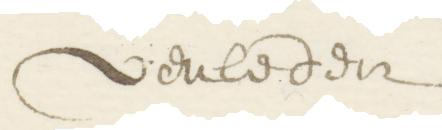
verleden
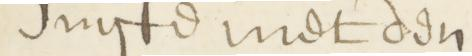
suijte met den
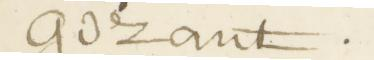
gezant.
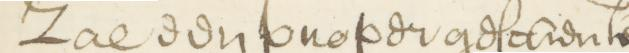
zal een proper geschenk
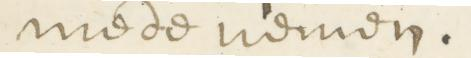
mede nemen.
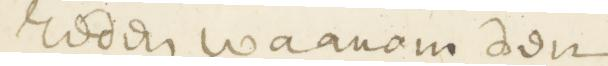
reden waarom den
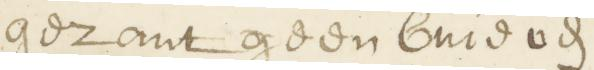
gezant geen brieven
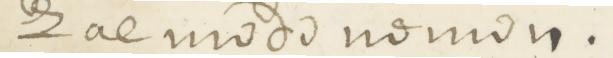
zal mede nemen.
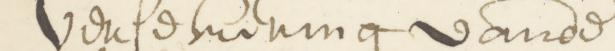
versekering vande
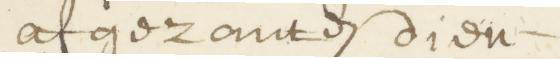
afgezanten dien
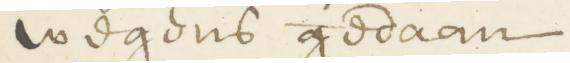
wegens gedaan
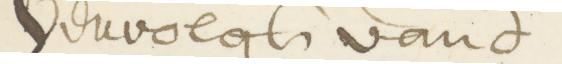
vervolgh van d'
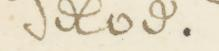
seloe.
